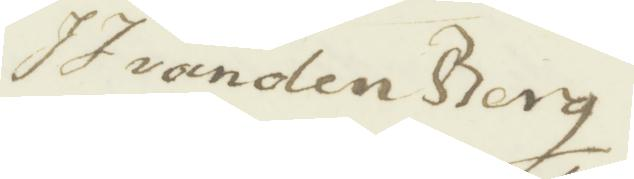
JI van den Berg
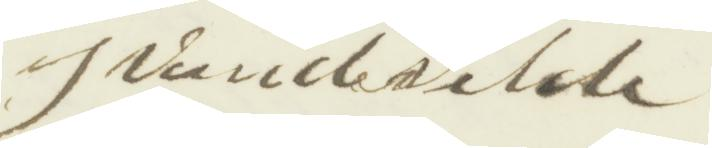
J van de Velde
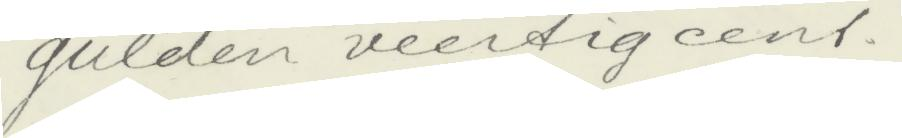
gulden veertig cent.
